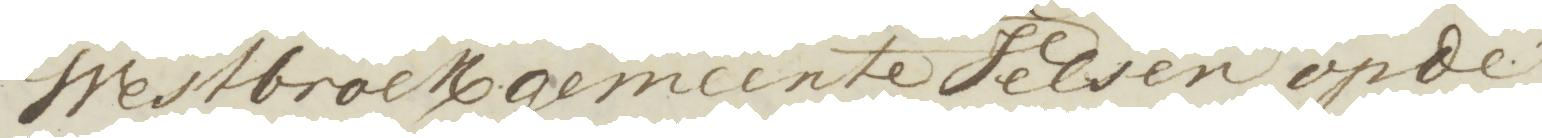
Westbroek gemeente Velsen op de
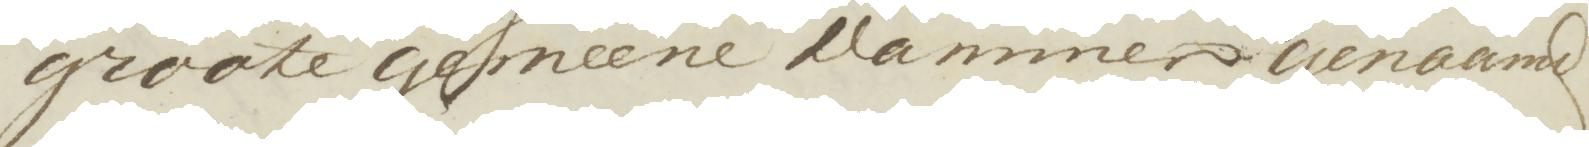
groote gemeene Dammer genaamd
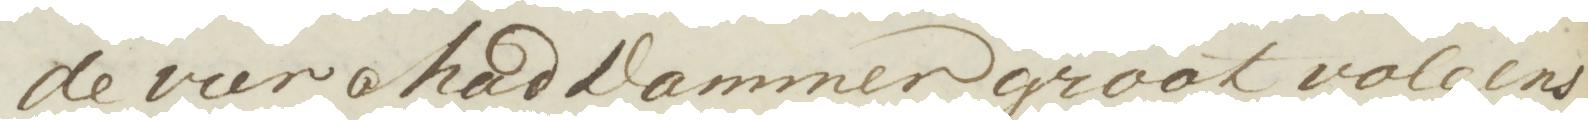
de vier Mad Dammer groot volgens
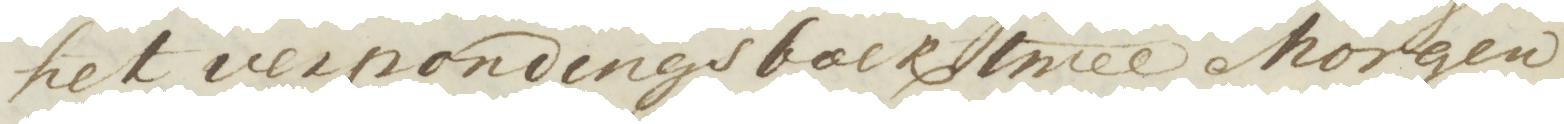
het verpondings boek twee Morgen
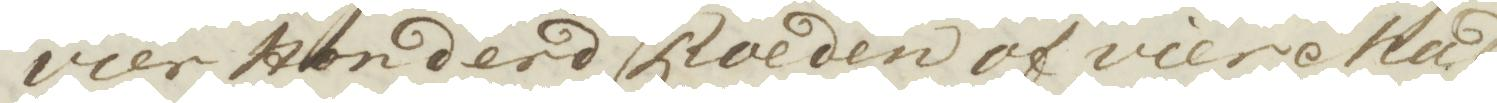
vier honderd Roeden of vier Na d
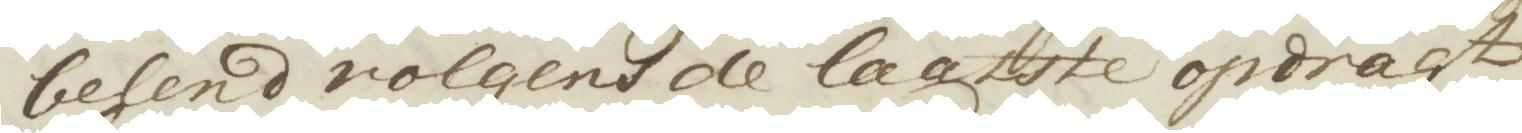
belend volgens de laatste opdragt
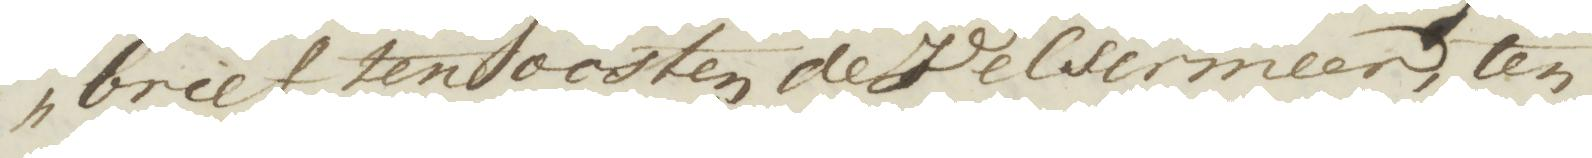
„brief ten oosten de Velsermeer, ten
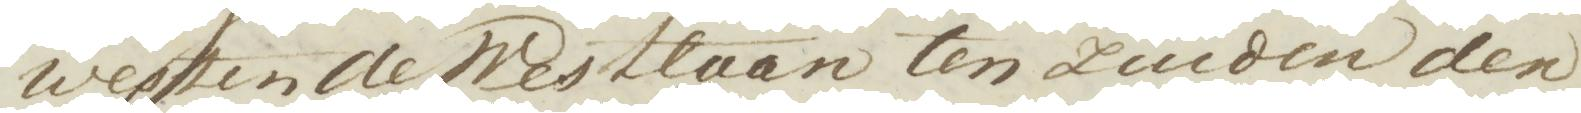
westen de Westlaan ten zuiden den
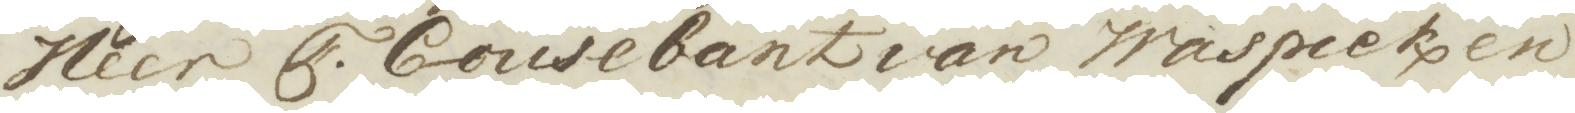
Heer F. Cousebant van Waspick en
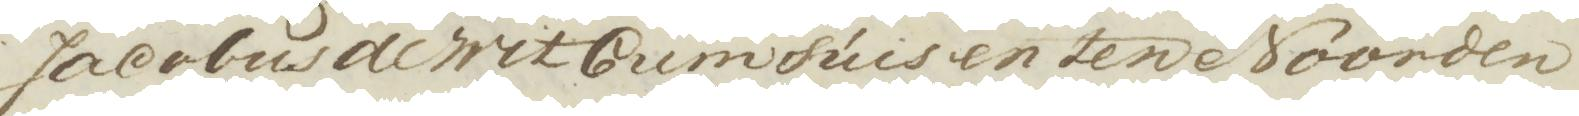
Jacobus de wit cum suis en ten Noorden
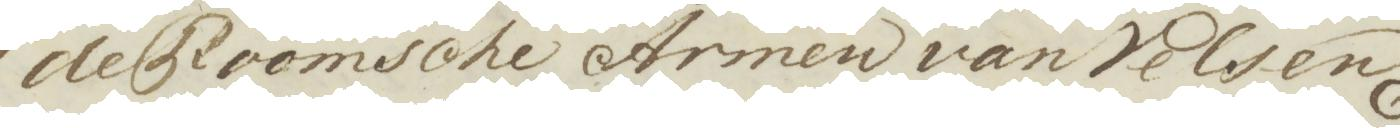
de Roomsche Armen van Velsen
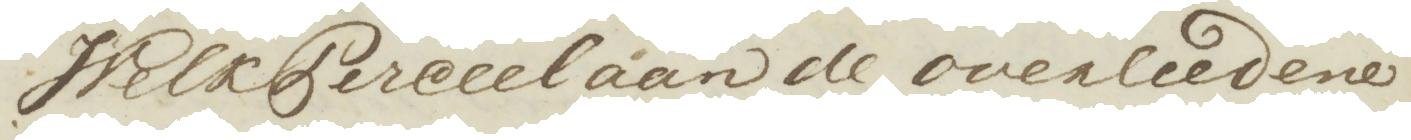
Welk Perceel aan de overleedene
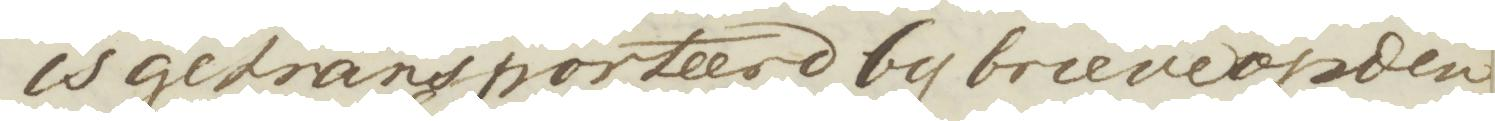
is getransporteerd by brieve op den
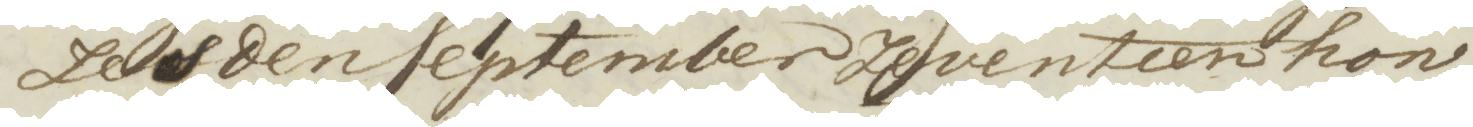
zesden september zeventien hon
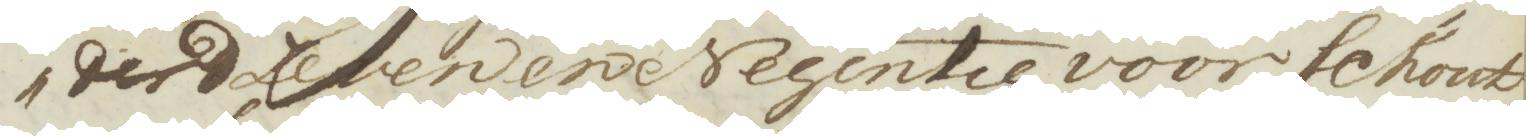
„derd zeven en Negentig voor schout
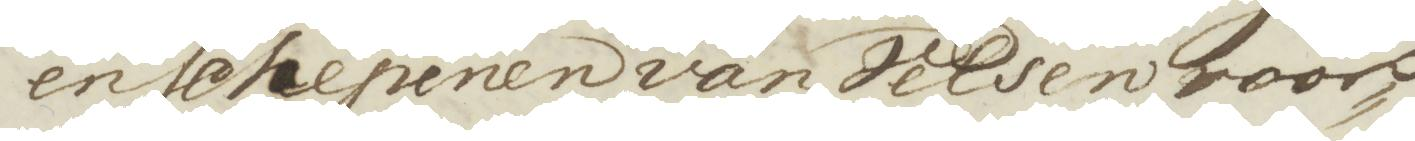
en schepenen van Velsen voor„
